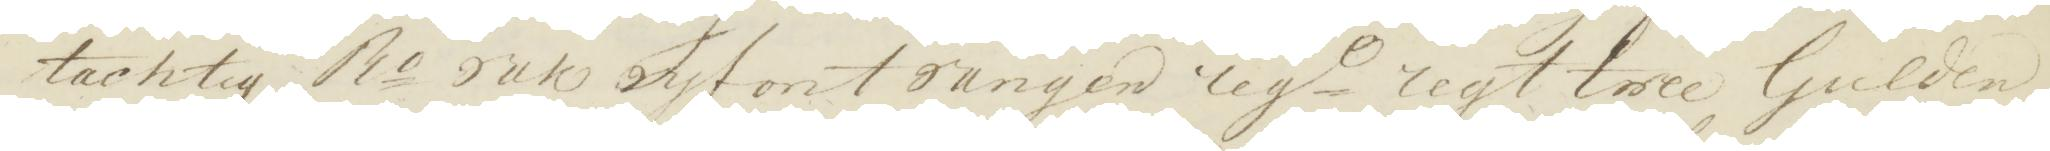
tachtig N=o vak vyf ontvangen reg=o regt twee Gulden
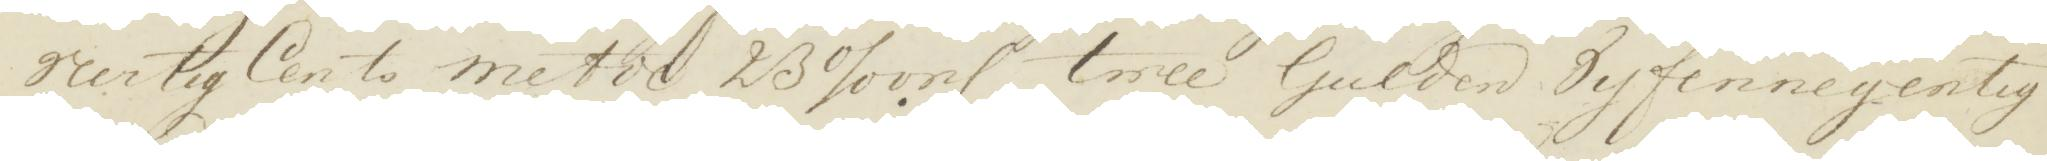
veertig Cents met de 23% onc twee Gulden Vyfennegentig
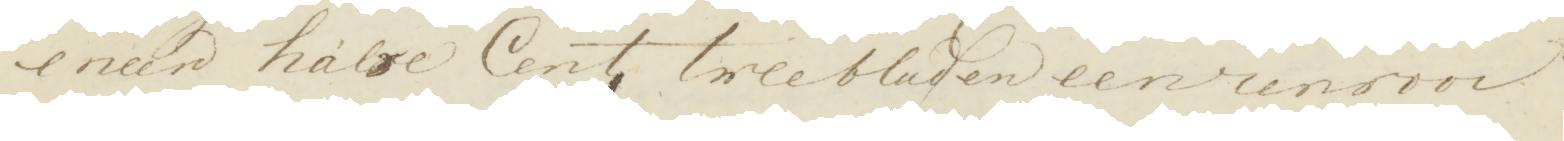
en een halve Cent twee bladen een renvooi
